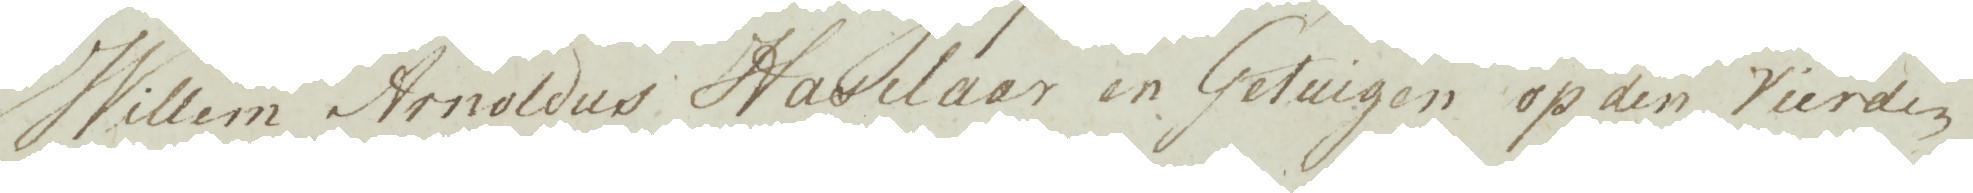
Willem Arnoldus Haselaar en Getuigen op den Vierden
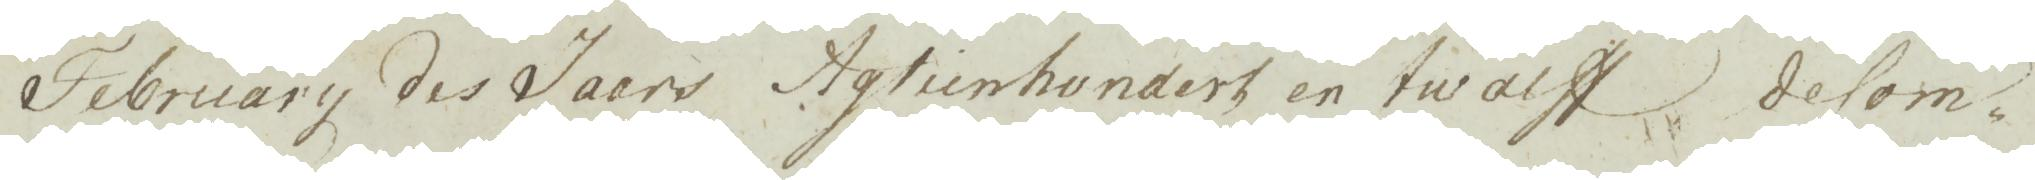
February des Iaars Agtienhondert en twalff, de Com„
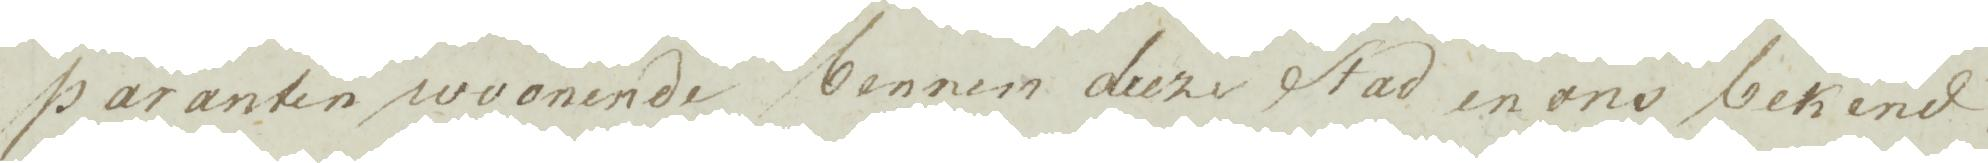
paranten woonende bennen deeze stad en ons bekend
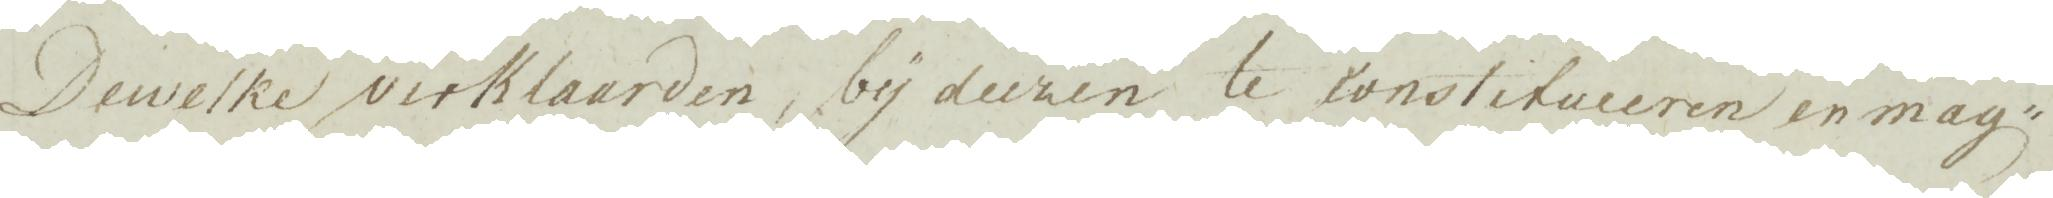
Dewelke verklaarden, bij deezen te constitueeren en mag„
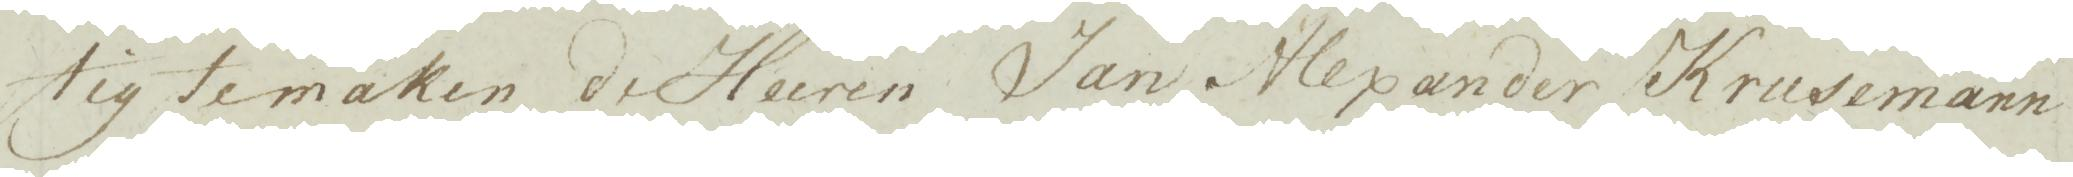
tig temaken de Heeren Ian Alexander Krusemann
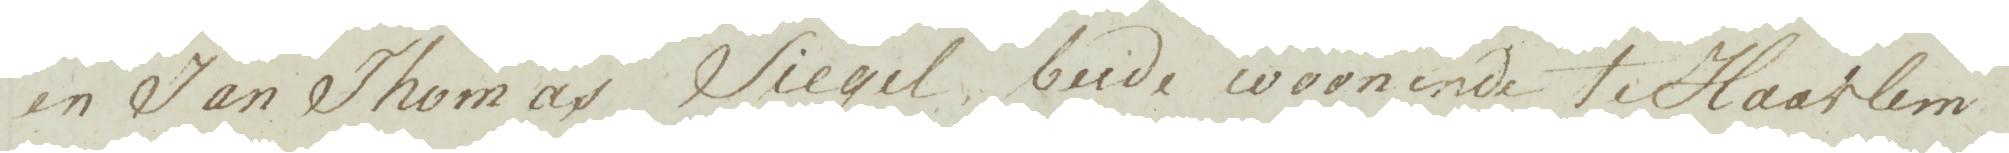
en Ian Thomas Siegel, beide woonende te Haarlem
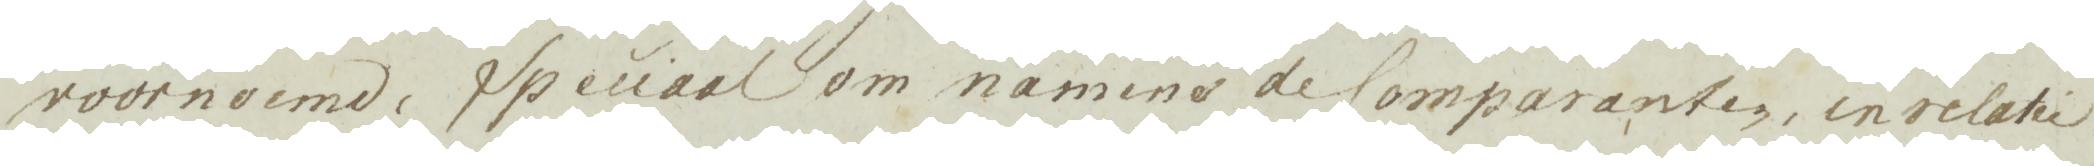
voornoemd, speciaal om namens de Comparanten, in relatie
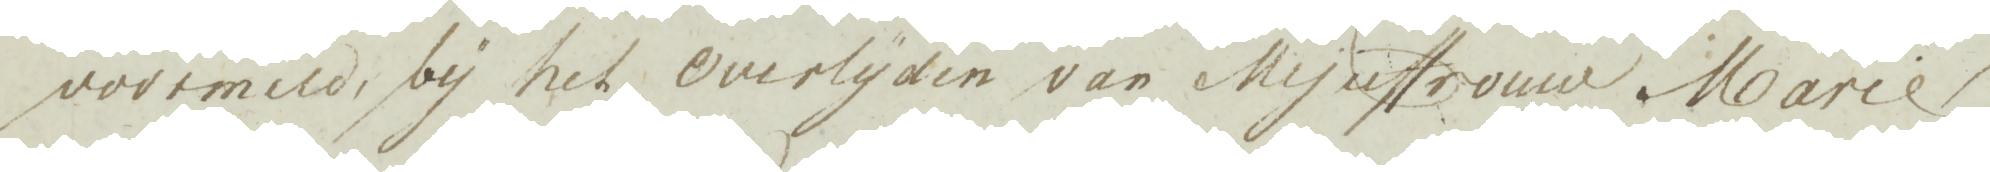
voormeld, bij het overlijden van Mejuffrouw Marie
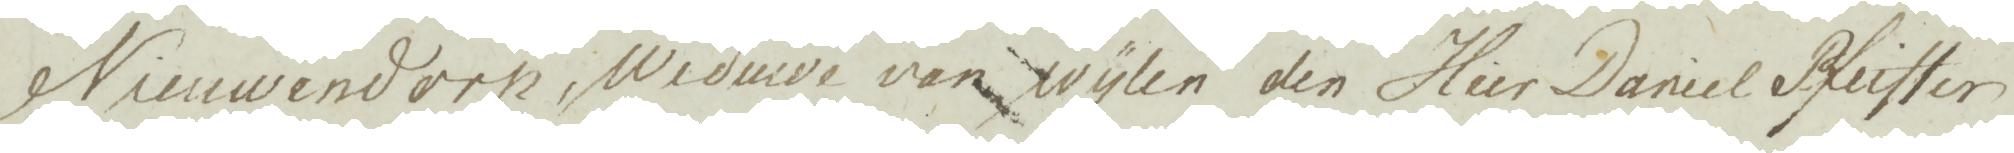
Nieuwendorp, Weduwe van wijlen den Heer Daniel Pfeiffer
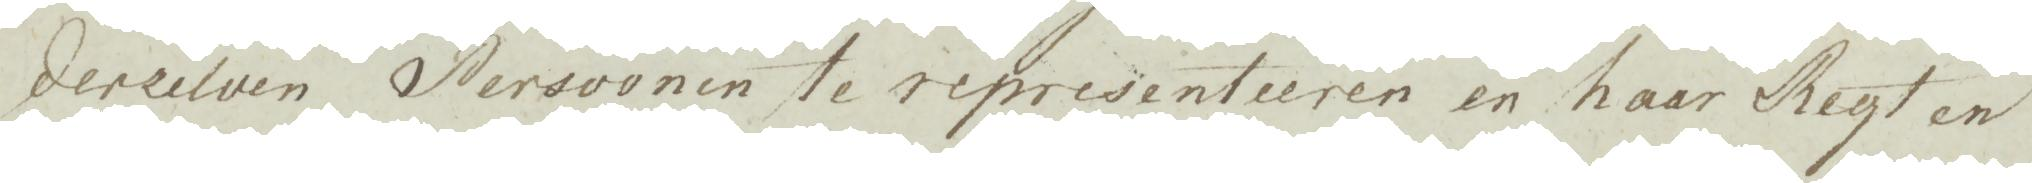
derzelven Persoonen te representeeren en haar Regt en
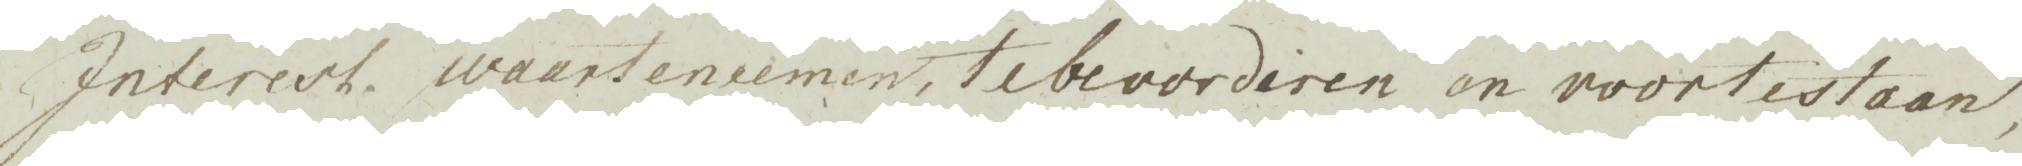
Jnterest waarteneemen, te bevorderen en voortestaan
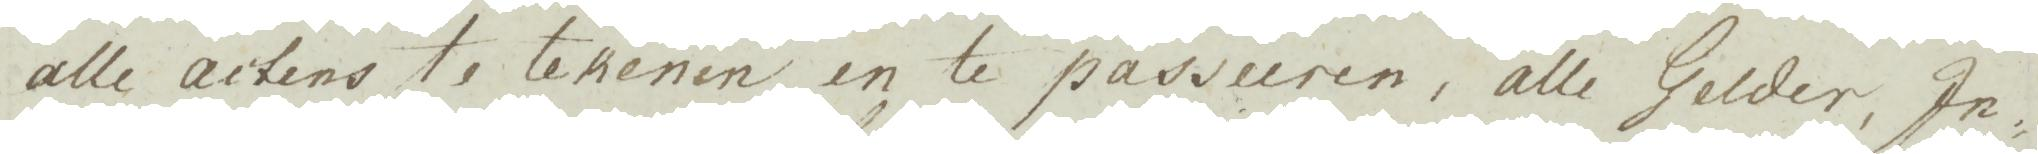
alle actens te tekenen en te passeeren, alle Gelder, Jn„
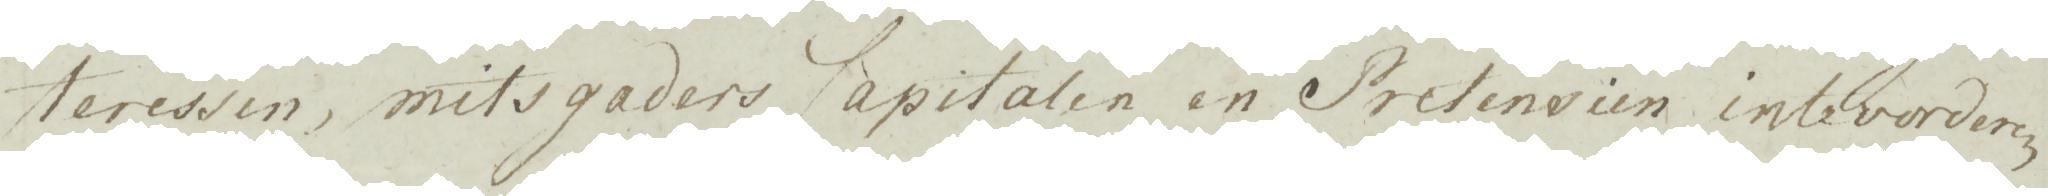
teressen, mitsgaders Capitalen en Presensien inte vorderen
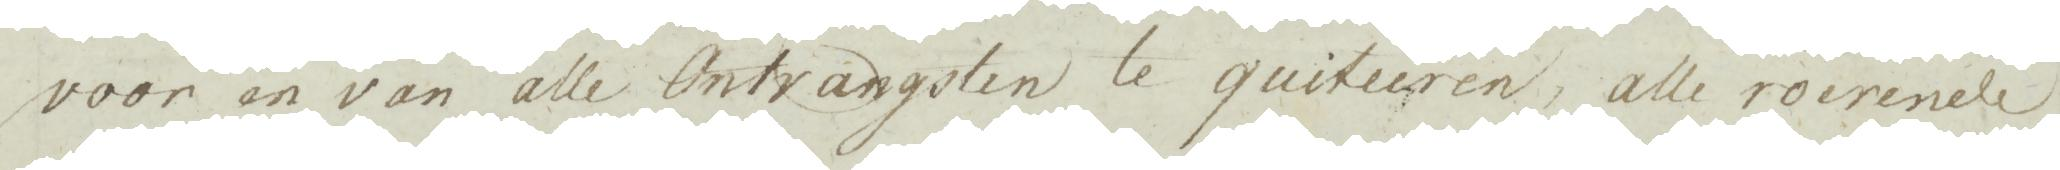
voor en van alle Ontvangsten te quiteeren, alle roerende
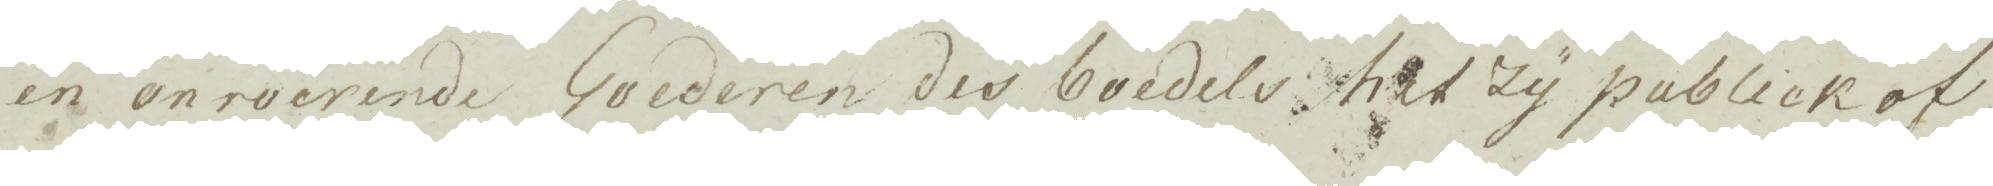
en onroerende Goederen des boedels het zij publiek of
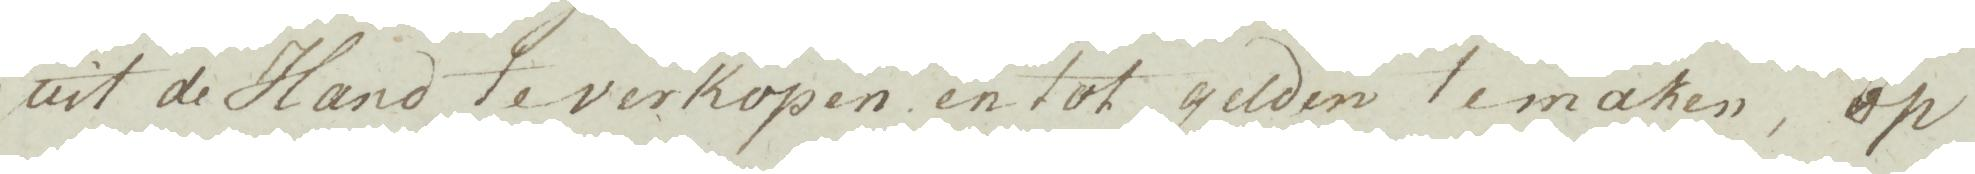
uit de Hand te verkopen en tot gelden te maken, op
